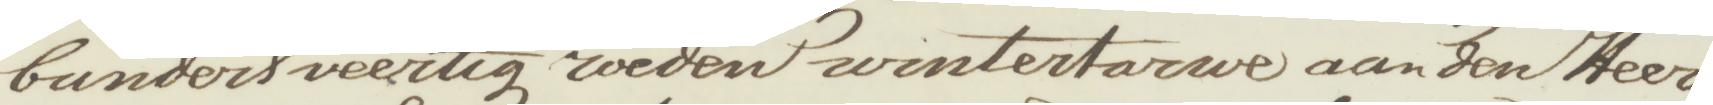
bunders veertig roeden wintertarwe aan den Heer
